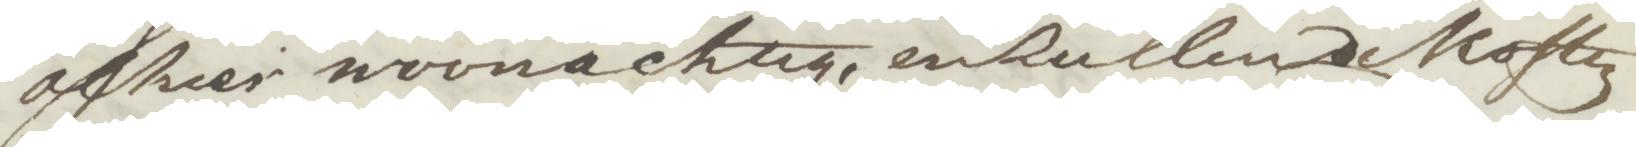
alhier woonachtig, en zullende kosten
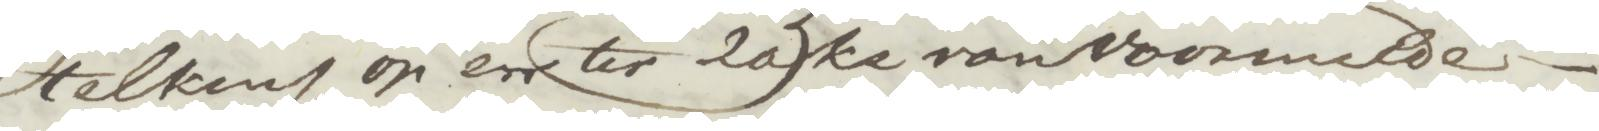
telkens op en ter zake van voormelde
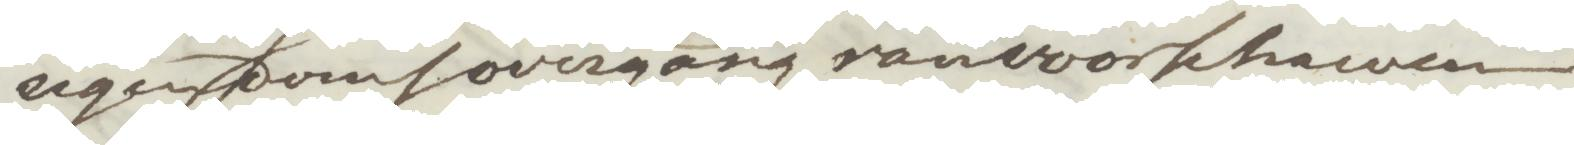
eigendoms overgang van voorschreeven
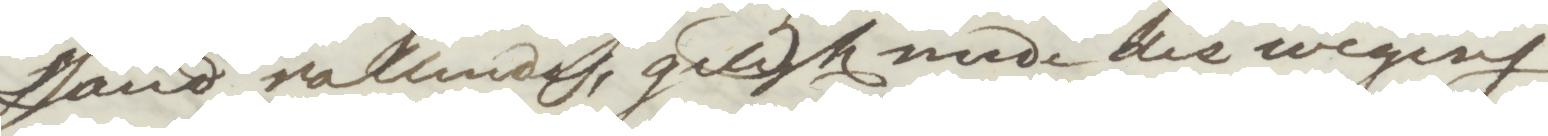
Land vallende, gelyk mede die wegens
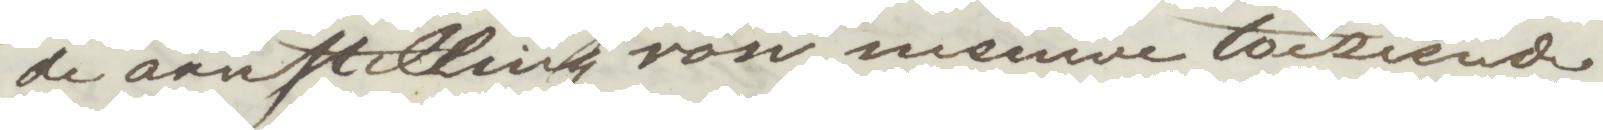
de aanstelling van nieuwe toeziende
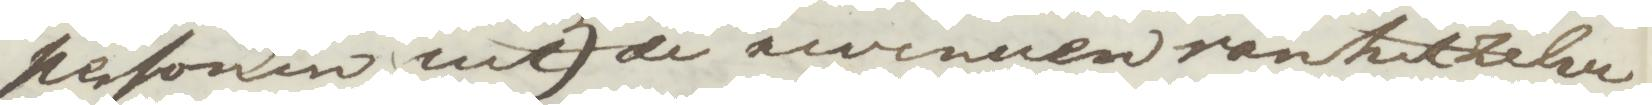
personen uit de revenuen van het zelve
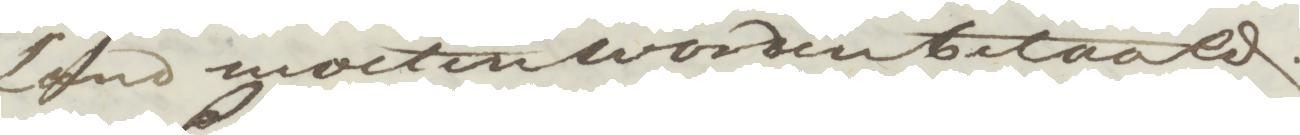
Land moeten worden betaald.
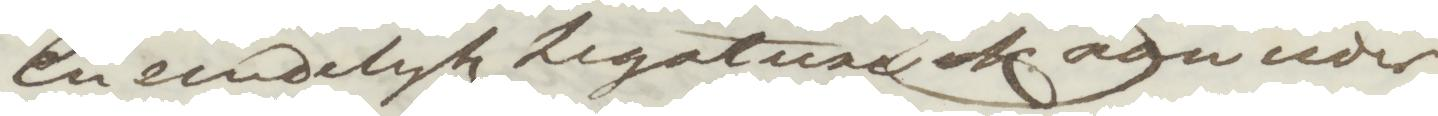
En eindelyk legateere ik aan ieder
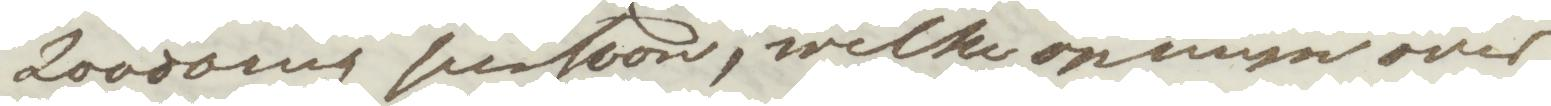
zoodanig persoon, welke op myn over
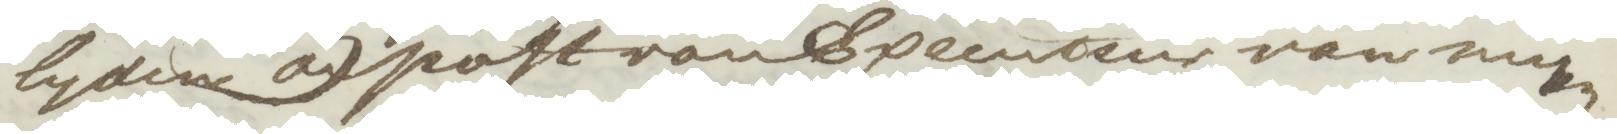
=lyden de post van Executeur van myn
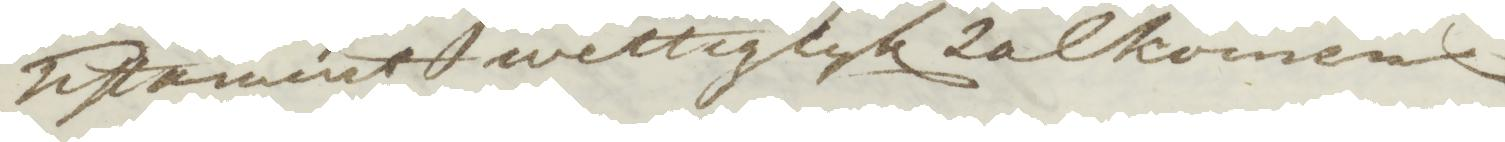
testament wettiglyk zal koomen
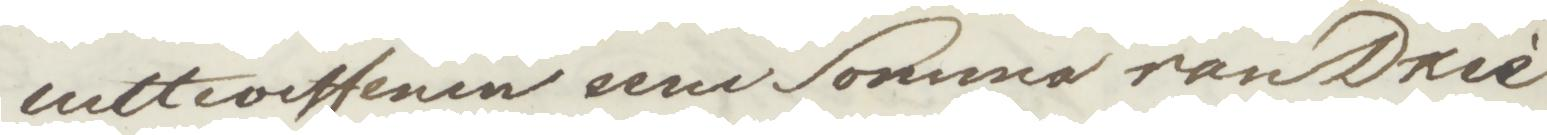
uitteoeffenen eene somma van Drie
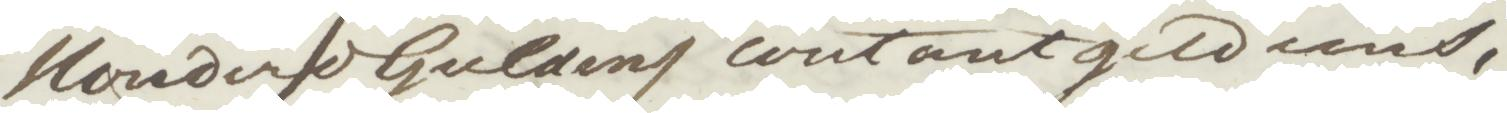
Honderd Guldens contant geld eens,
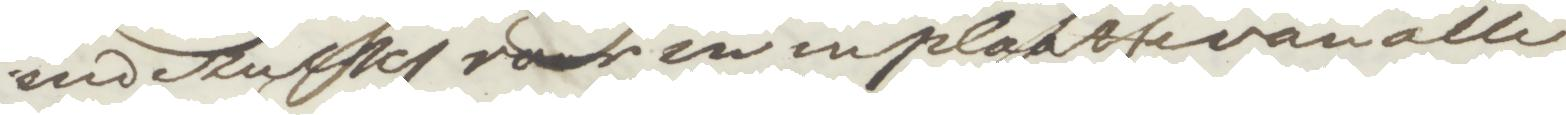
ende zulks voor en in plaatse van alle
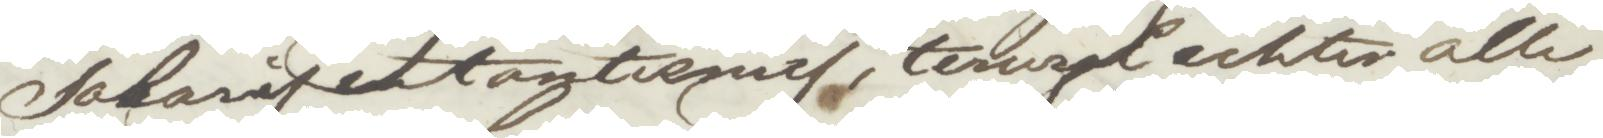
Salaris en tantiemes, terwyl echter alle
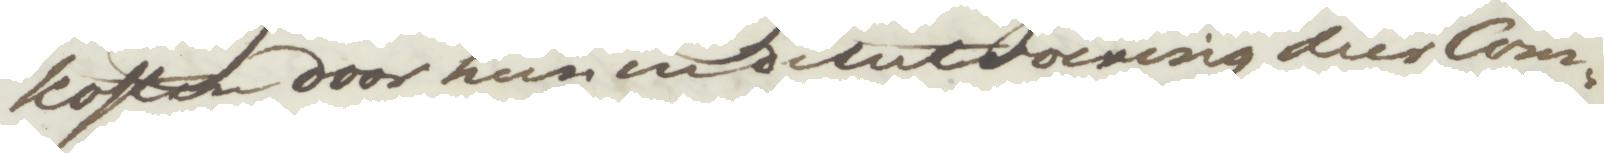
kosten door hun in de uitvoering dier com„
